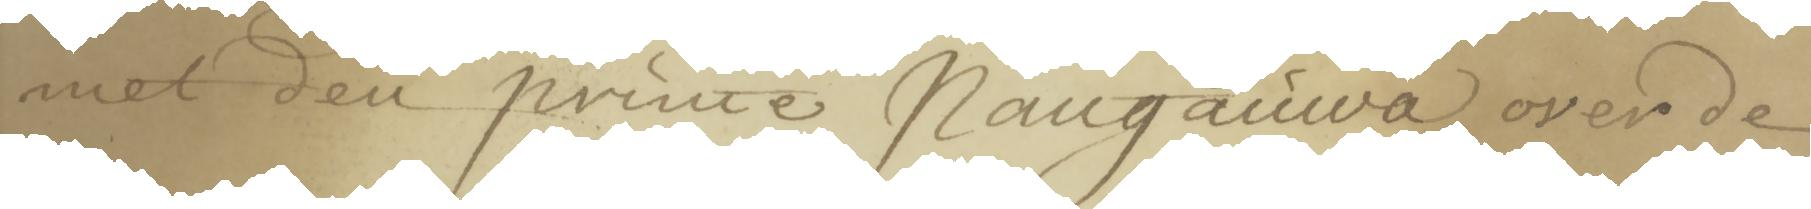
met den prince Pangauwa over de
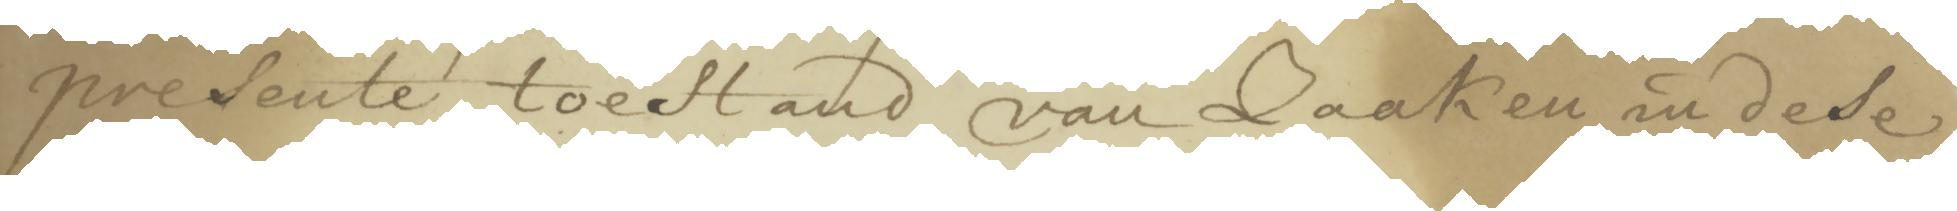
presente toestand van zaaken in dese
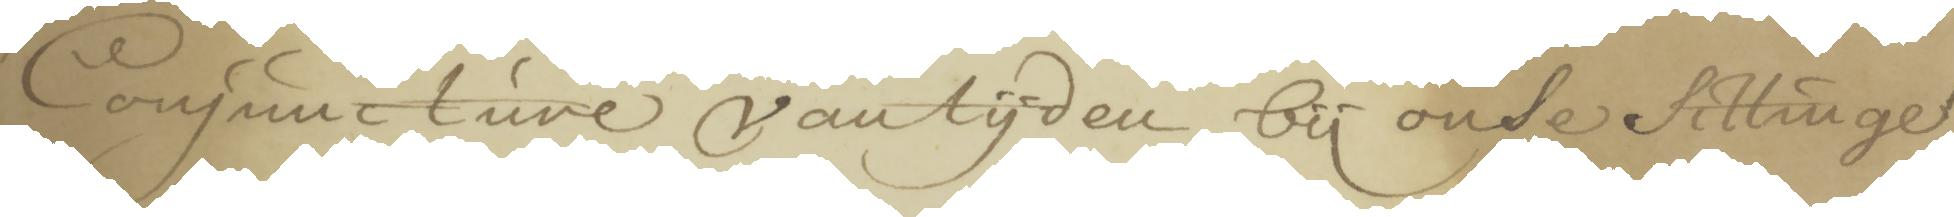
Conjuncture van tijden bij onse sittinge
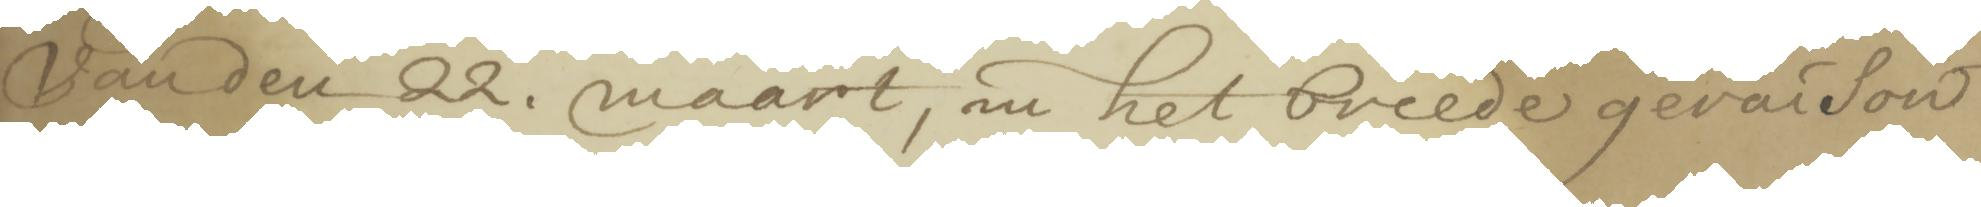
van den 22. maart, in het breede geraison
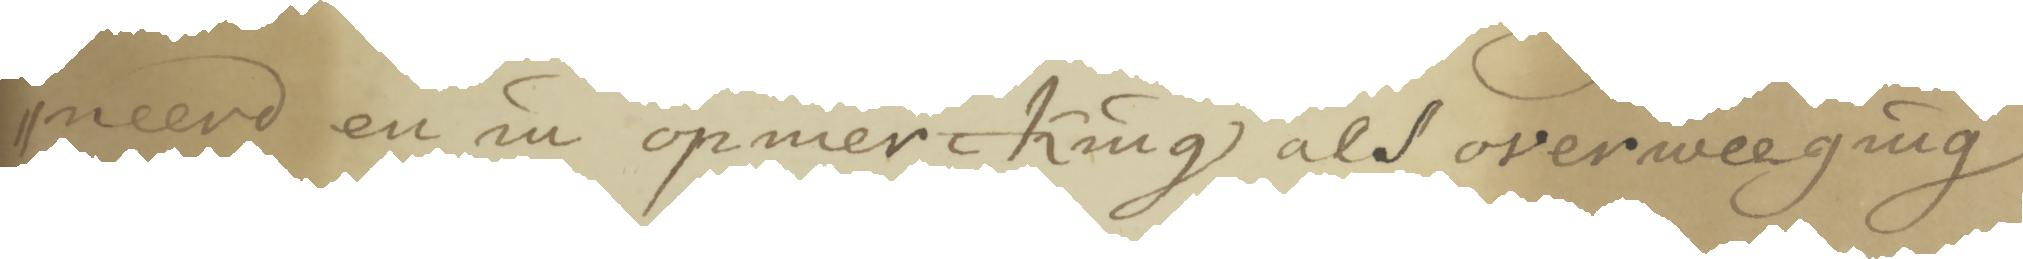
„neerd en in opmercking als overweeging
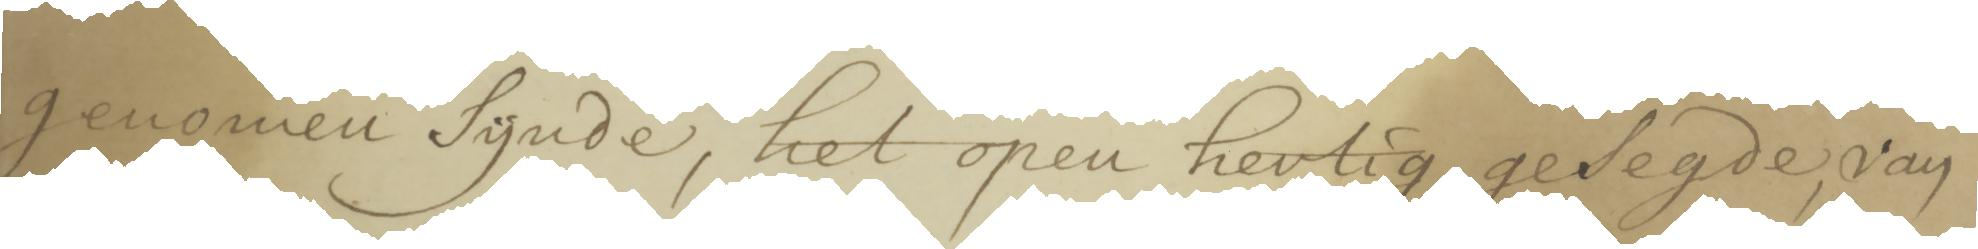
genomen sijnde, het open hertig gesegde, van
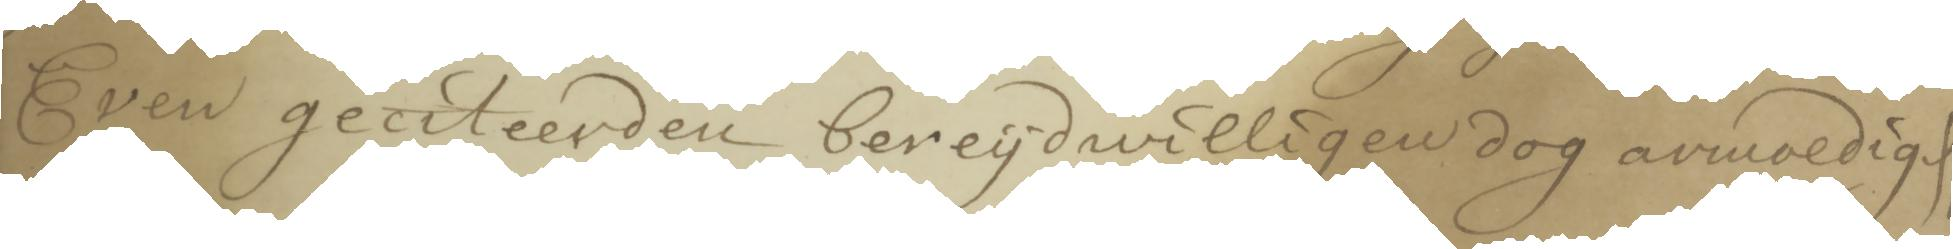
Even geciteerden bereijdwilligen dog armoedigen
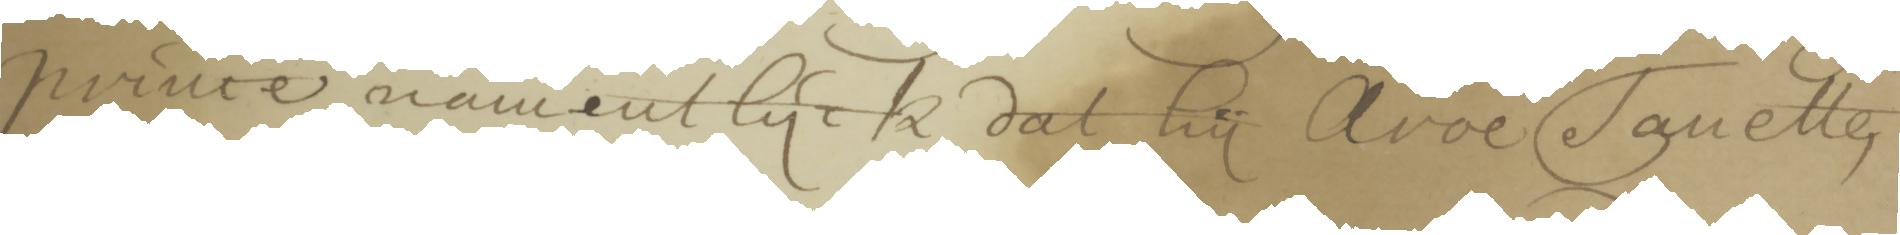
prince namentlijck dat hij Aroe Tanette,
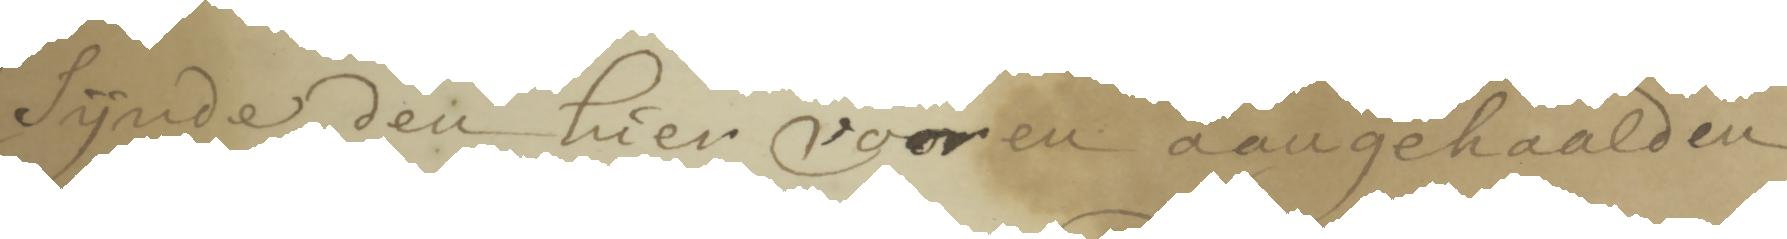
sijnde den hier vooren aangehaalden
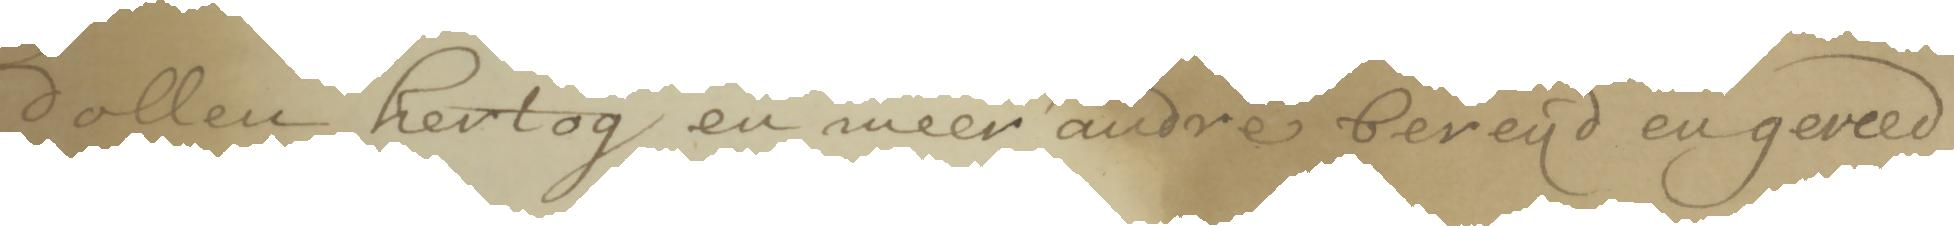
dollen hertog en meer andre bereijd en gereed
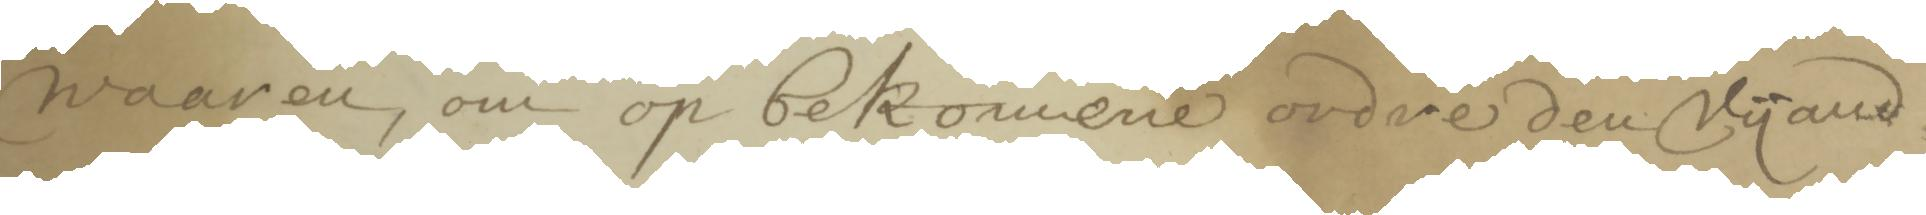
waaren, om op bekomene ordre den vijand
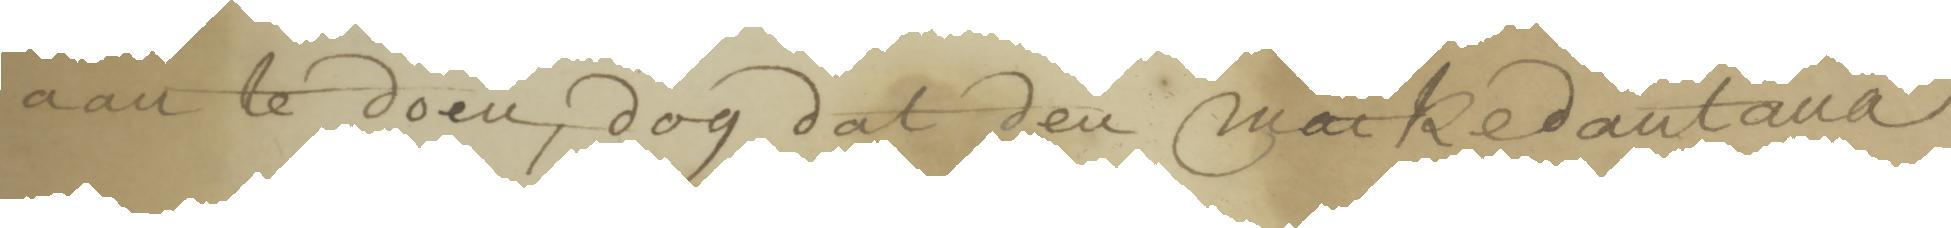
aan te doen, dog dat den mackedantana
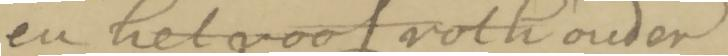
en het roof roth onder
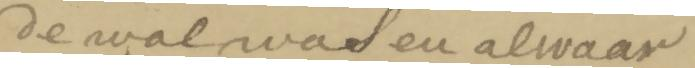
de wal was en alwaar
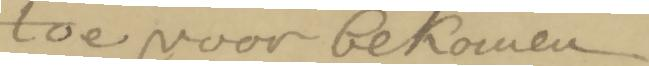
toe voor bekomen
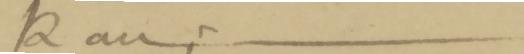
kan; —
